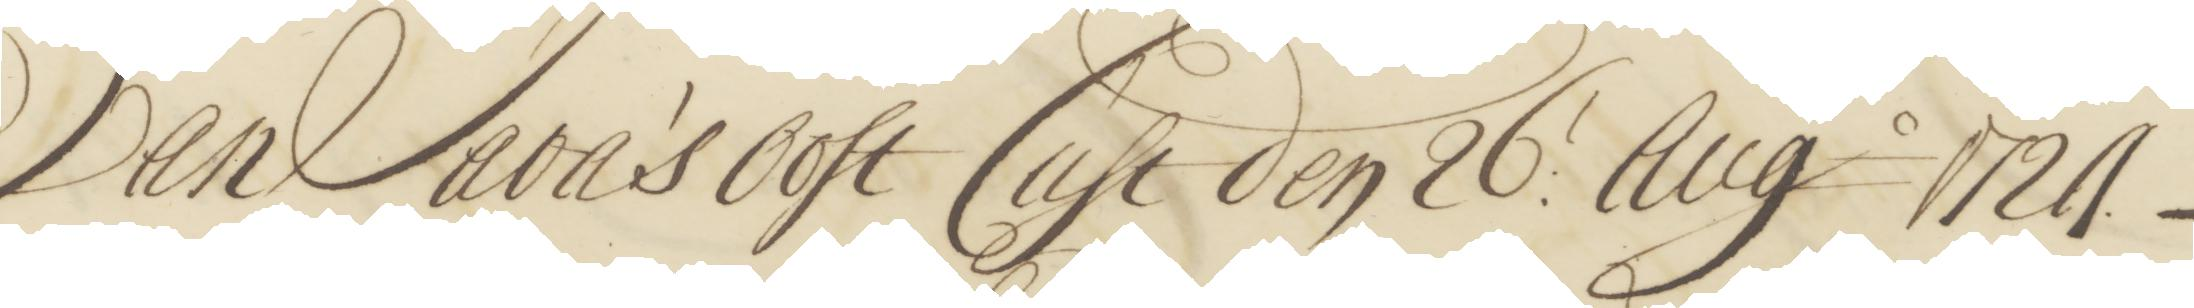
Van Iava's Oost Cust den 26:' Aug=o 1724. —
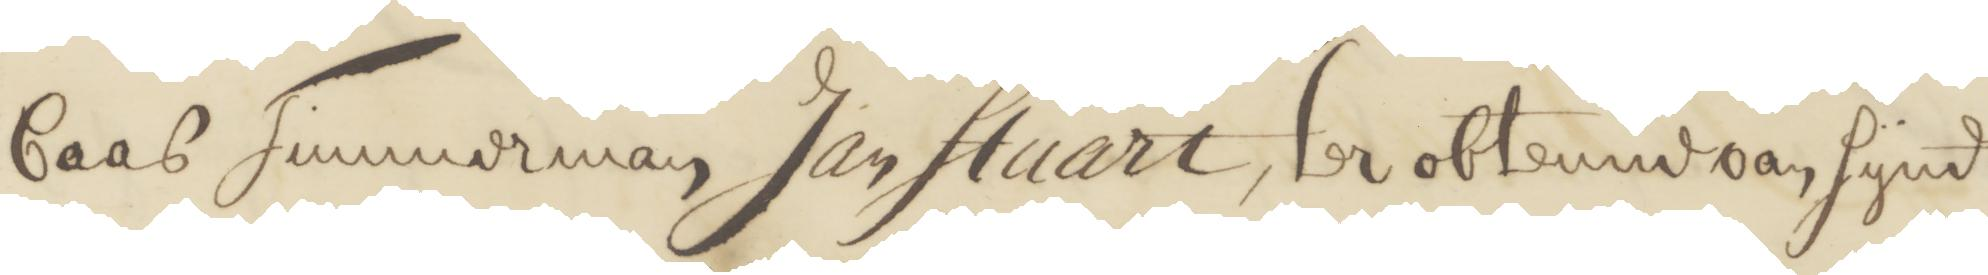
baas Timmerman Jan Stuart, ter obtenue van sijne
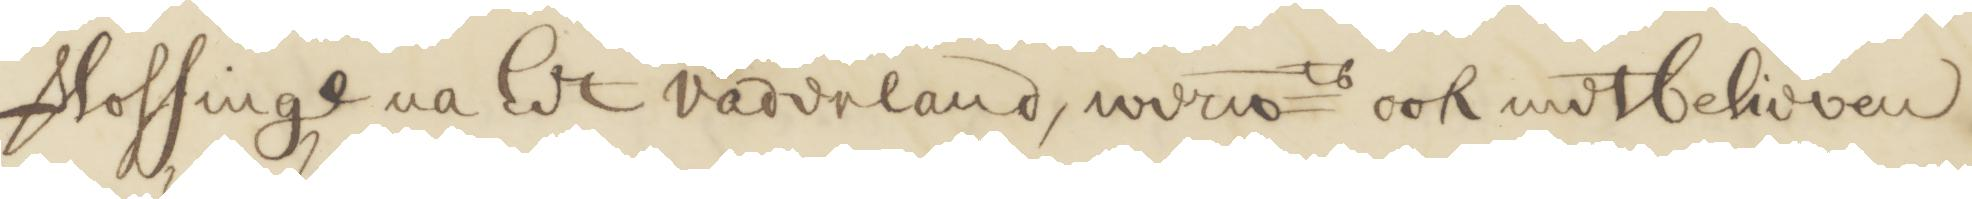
verlossinge na het Vaderland, werw=ts ook met believen
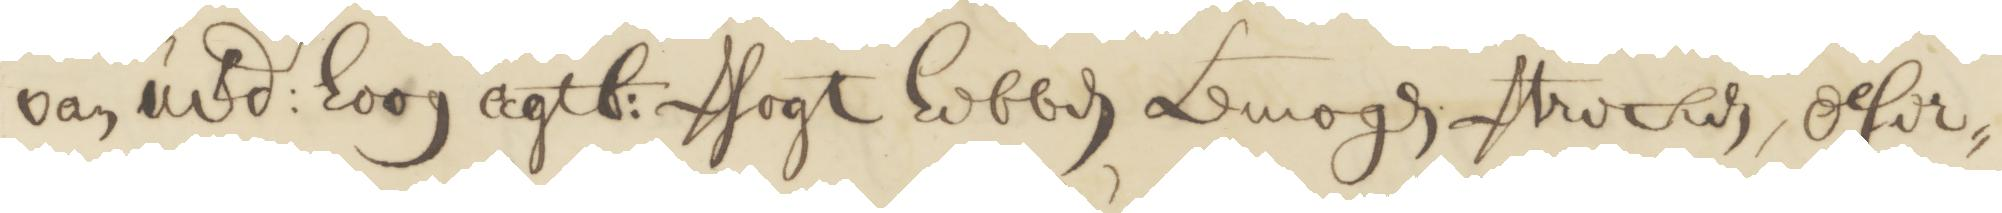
van uEd:' hoog agtb: versogt hebben te mogen vertrecken, deser„
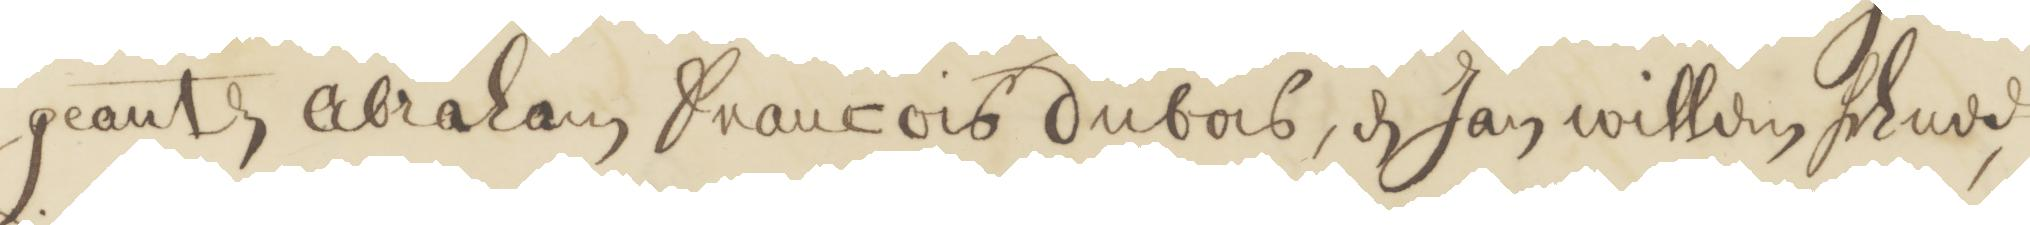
geanten Abraham francois dubois, en Jan willem schnee,
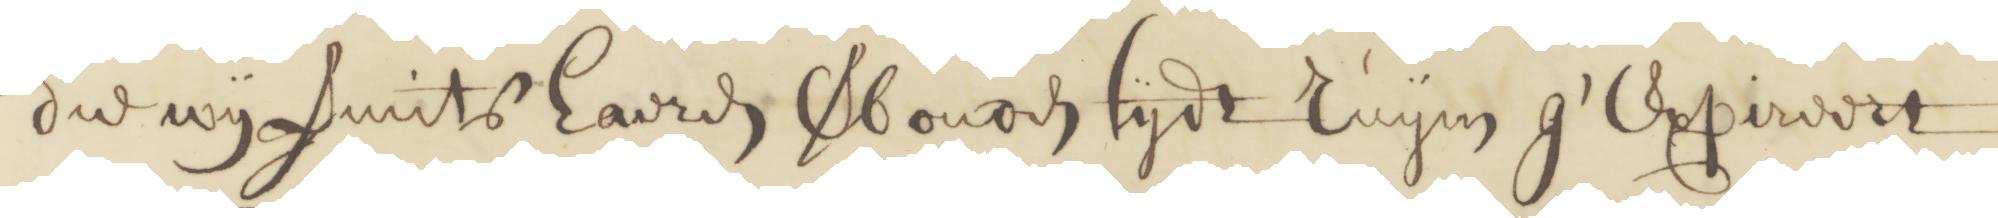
die wij vermits haeren verbonden tijdt Ruijm g’Expireert
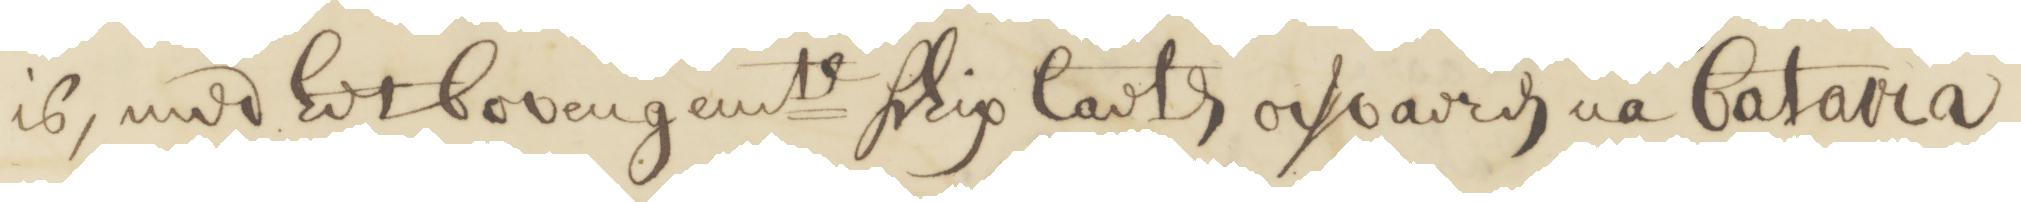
is, med het bovengem=te schip laeten overvaeren na batavia,
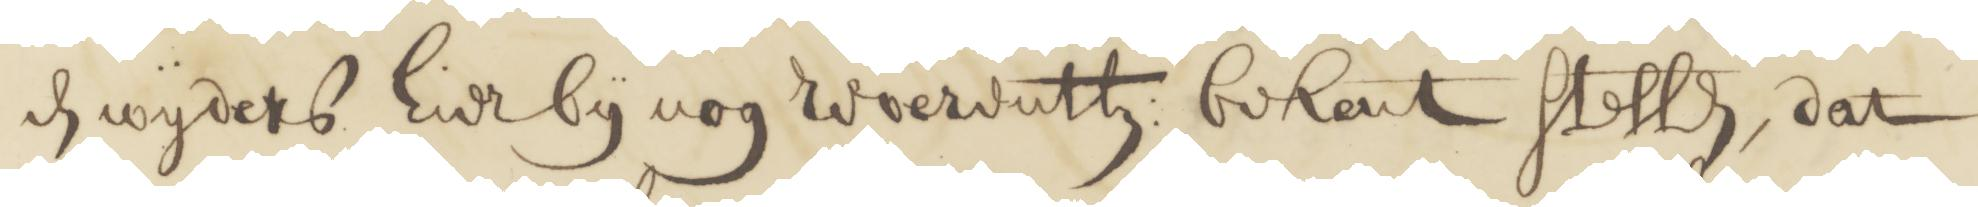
en wijders hierbij nog reverentlijk bekent stellen, dat
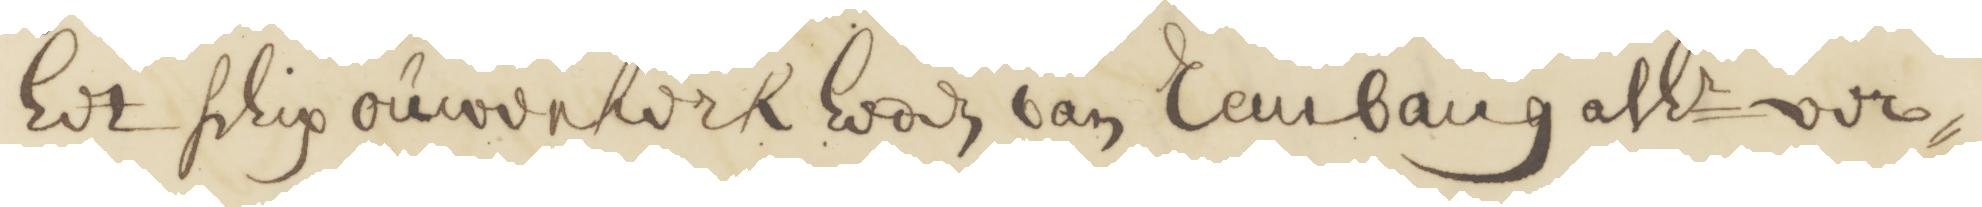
het schip ouwerkerk heden van Rembang alh=r ver„
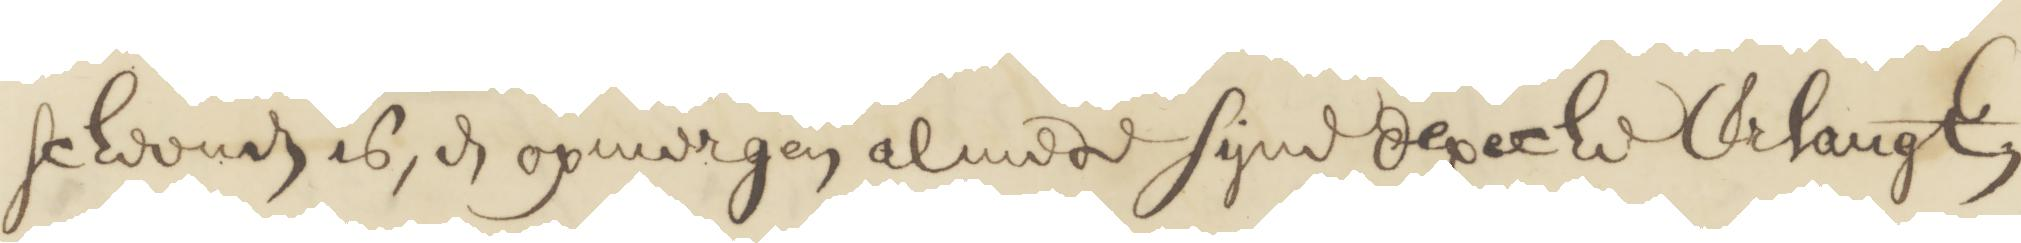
scheenen is, en op mergen almede sijne depeche Erlangten
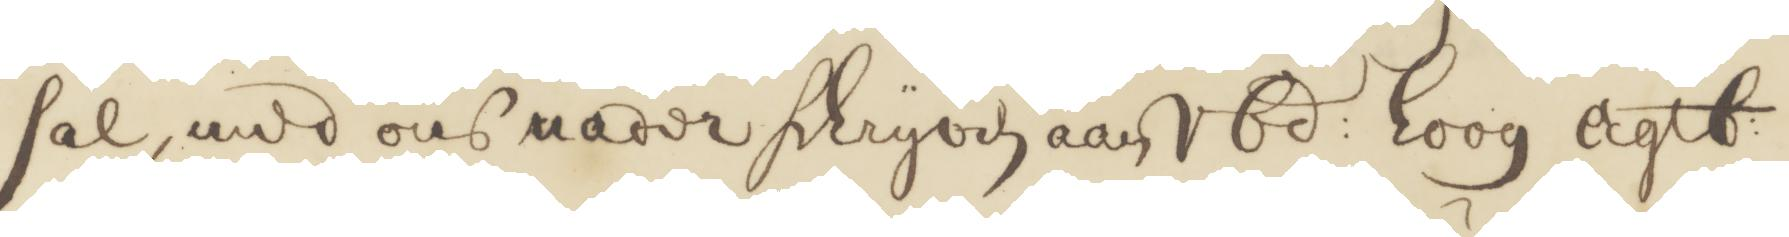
sal, med ons nader schrijven aan vEd: hoog agtb:
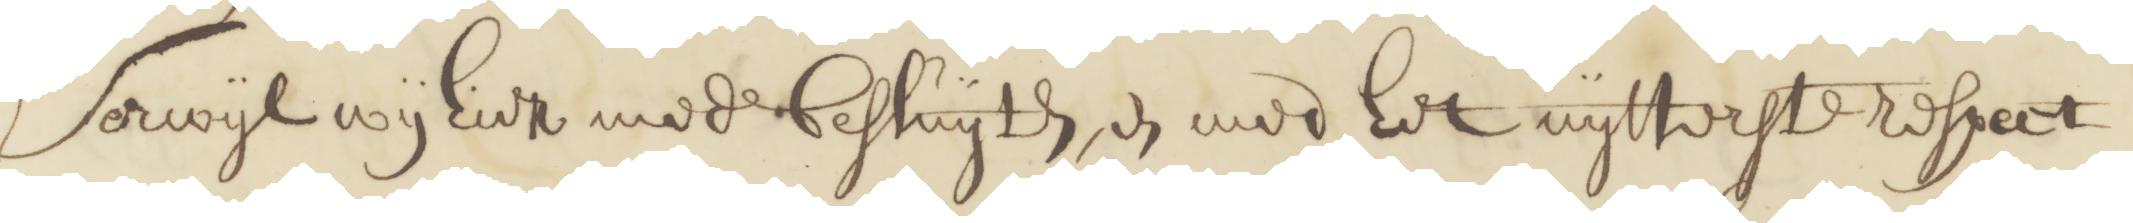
Terwijl wij hier mede besluijten, en med het uijtterste respect
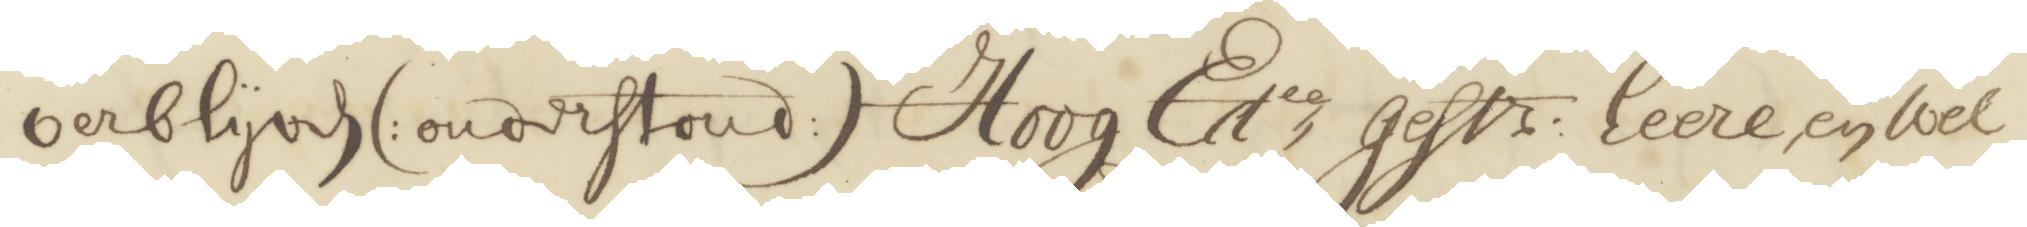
verblijven (: onderstond: ) Hoog Ed„le gestr: heere, en wel
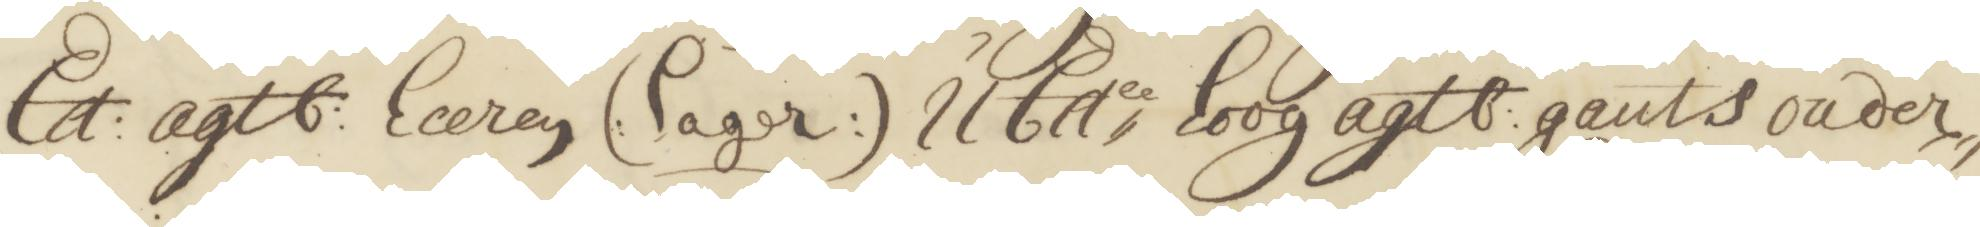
Ed: agtb: heeren (: lager: ) UEd„le hoog agtb: gants onder„
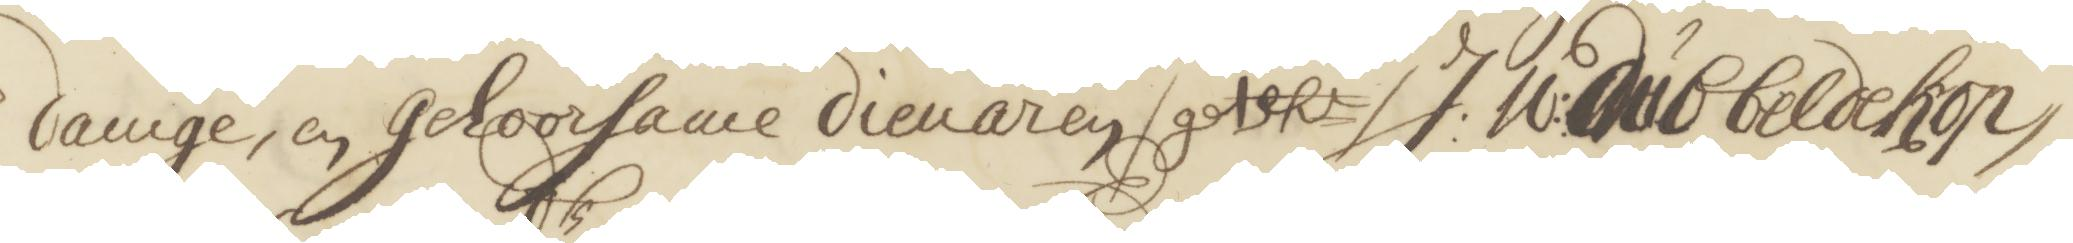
danige, en gehoorsame dienaren / getek=t / J: W: dubbeldekop,
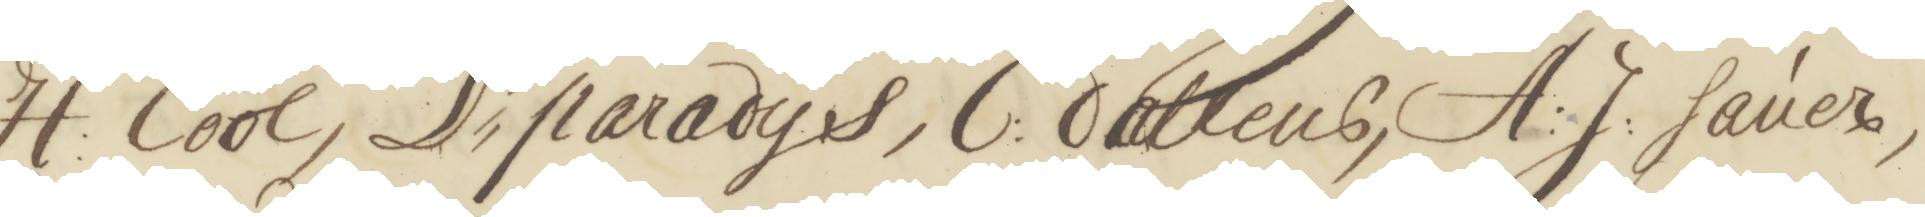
H: Cool, D„s paradijs, E: dallens, A: J: sauer,
